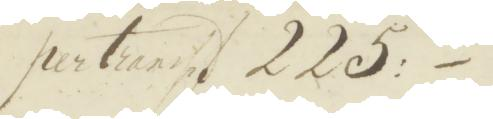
per transp ƒ 225: —
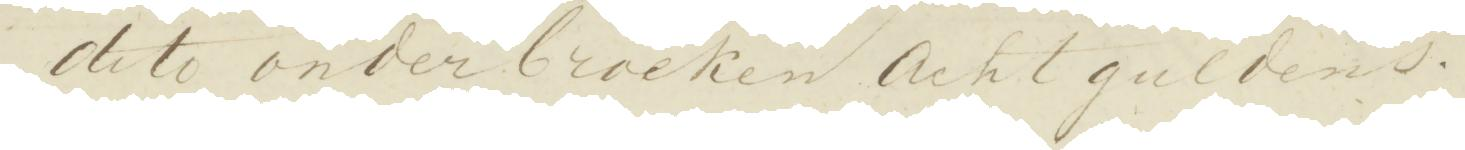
dito onderbroeken acht guldens.
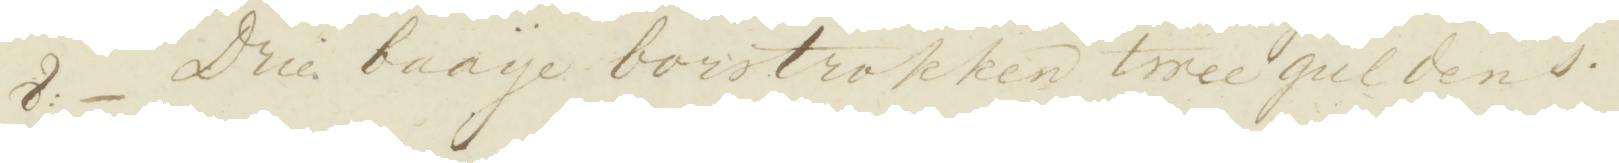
8: — Drie baaije borstrokken twee guldens.
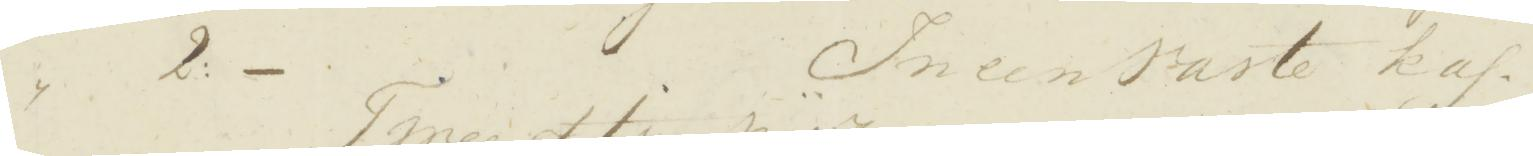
„ 2: — In een Vaste kas.
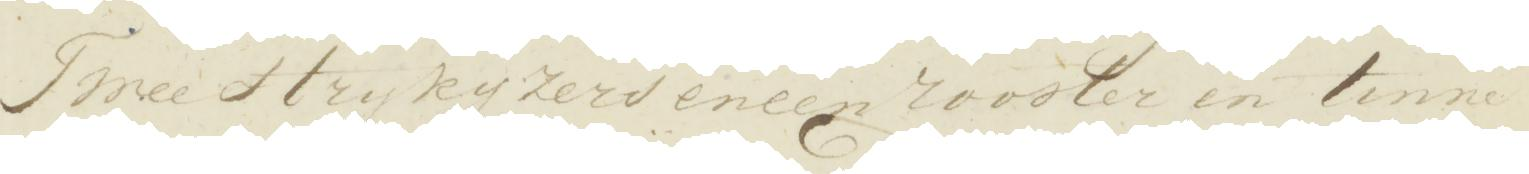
Twee strykijzers en een rooster en tinne
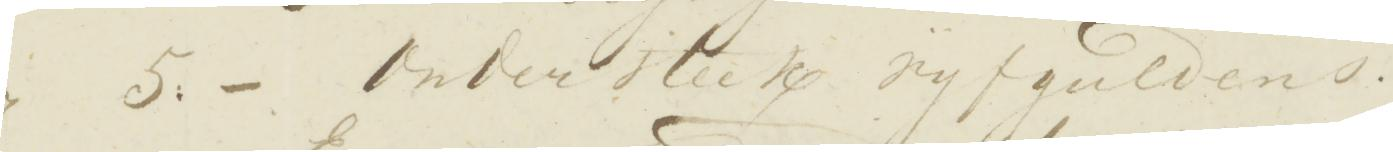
„ 5: — Ondersteek vijf guldens.
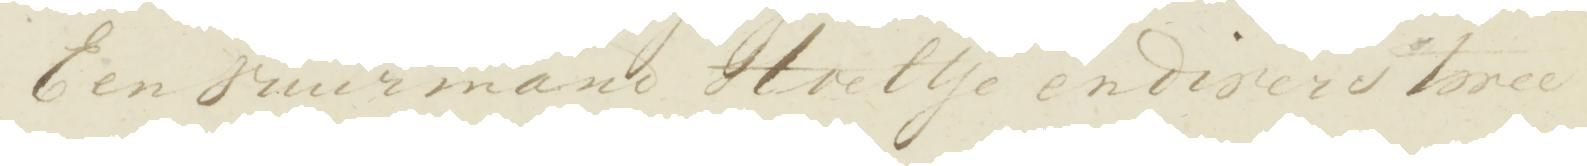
Een Vuurmand stoeltje en divers twee
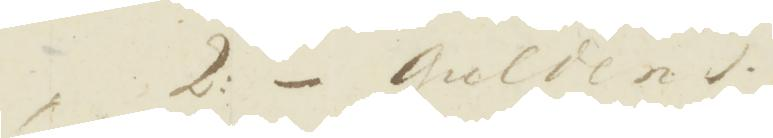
„ 2: — Guldens.
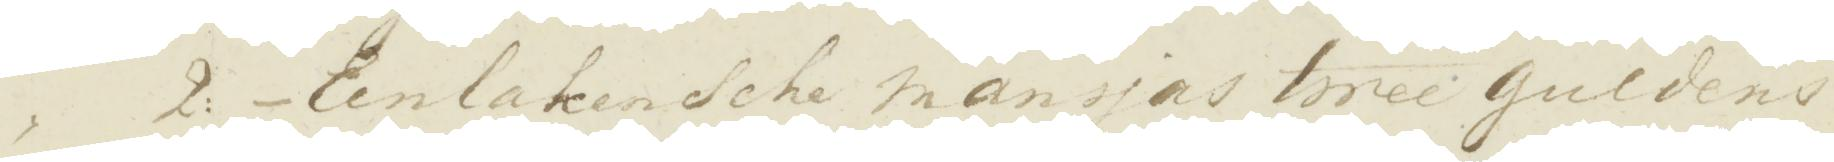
„ 2: — Een lakensche mansjas twee guldens
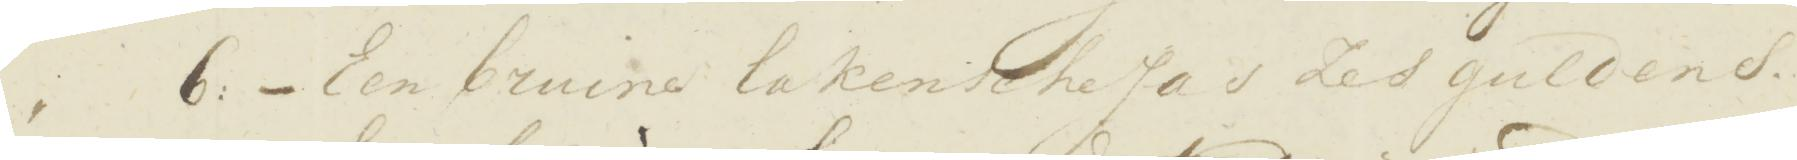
„ 6: —. Een bruine lakensche jas zes guldens.
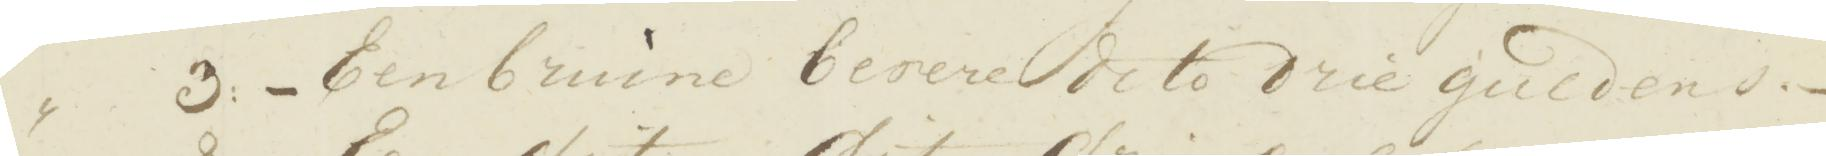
„ 3: — Een bruine bevere dito drie guldens. —
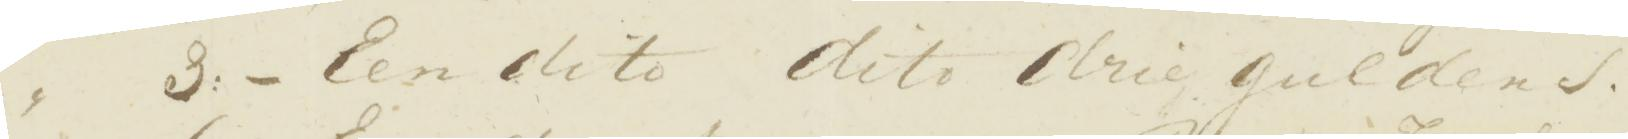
„ 3: — Een dito dito drie guldens.
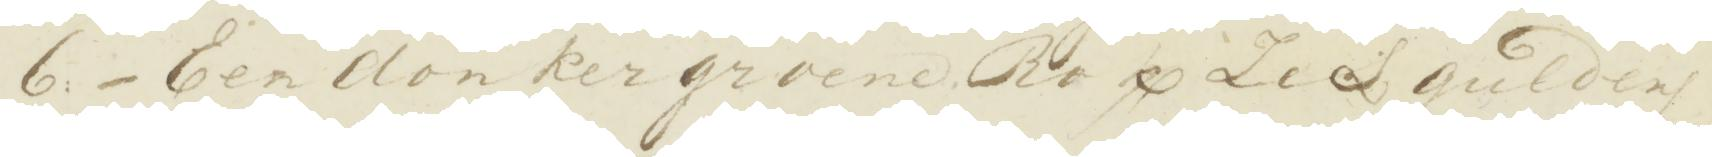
6: — Een donkergroene Rok zes guldens
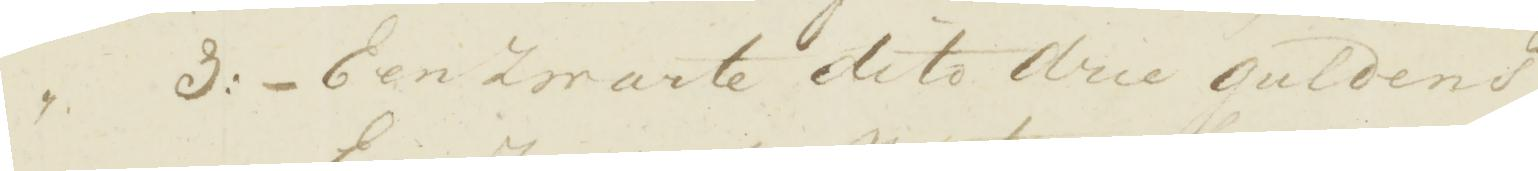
„ 3: — Een zwarte dito drie guldens
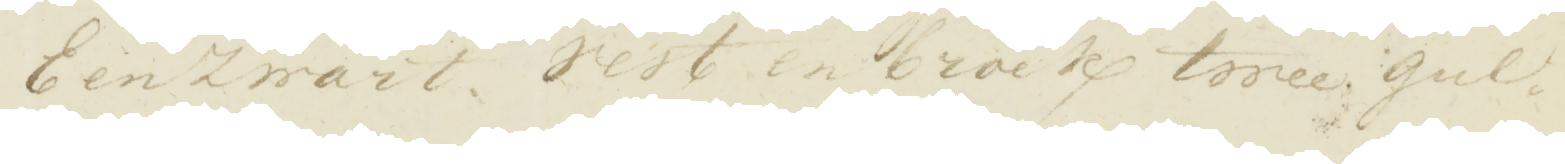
Een zwart. Vest en broek twee gul„
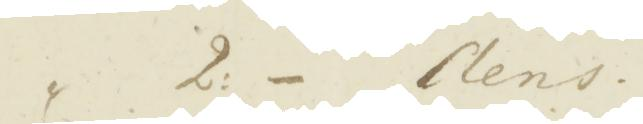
„ 2: — dens.
